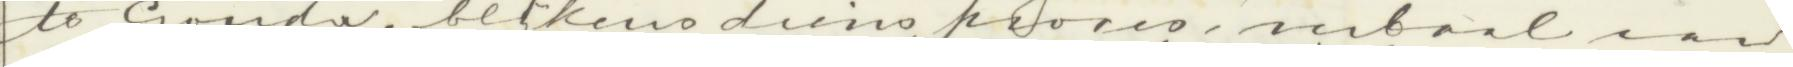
te Gouda, blijkens diens proces-verbaal van
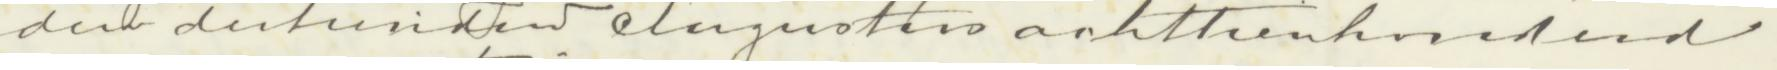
den dertienden Augustus achttienhonderd
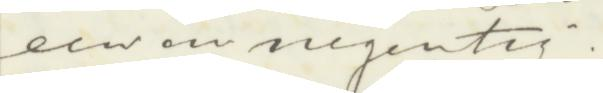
een en negentig.
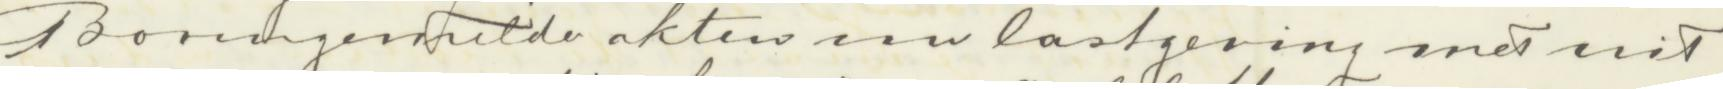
Bovengemelde akten een lastgeving met uit
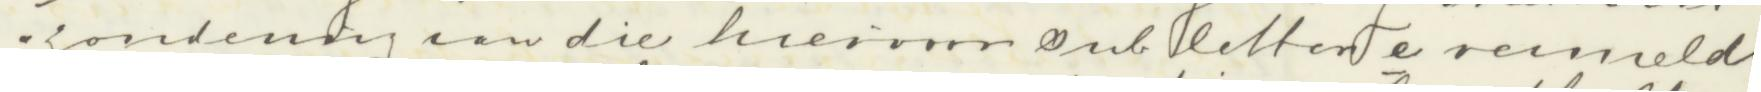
„zondering van de hierboven sub letter e vermeld
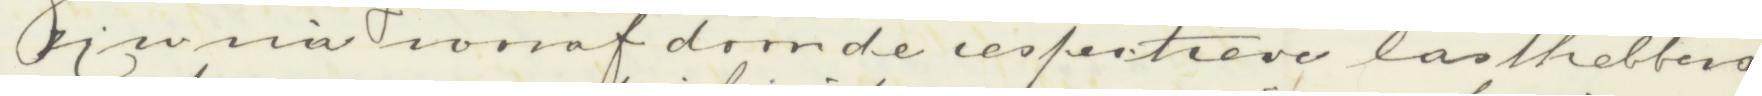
zijn nà vooraf door de respectieve lasthebbers
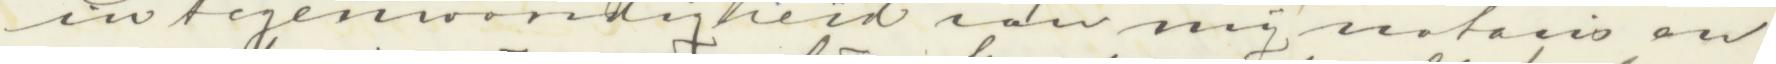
in tegenwoordigheid van mij notaris en
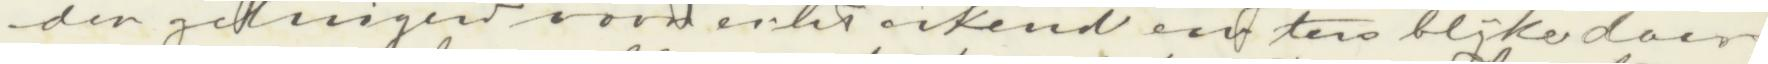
der getuigen voor echt erkend en ten blijke daar
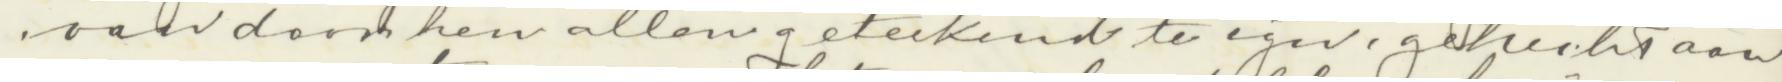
van door hen allen geteekend te zijn, gehecht aan
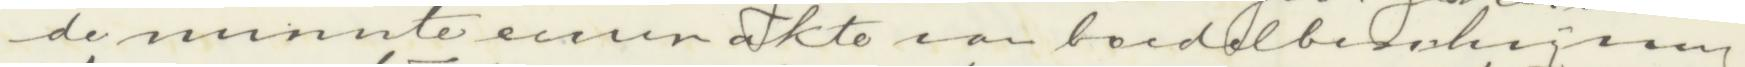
de minute eener akte van boedelbeschrijving
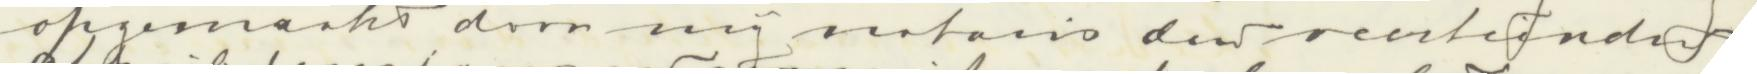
opgemaakt door mij notaris den veertienden
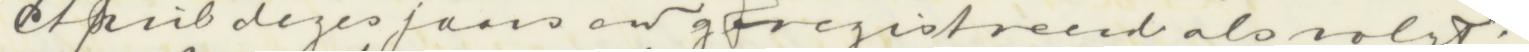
April dezes jaars en geregistreerd als volgt:
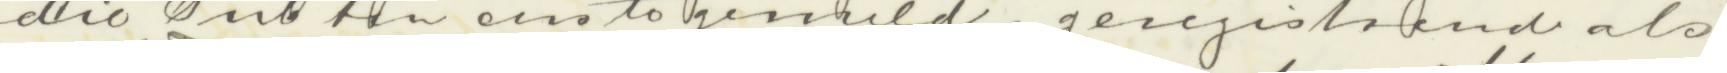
die sub ten eerste gemeld, geregistreerd als
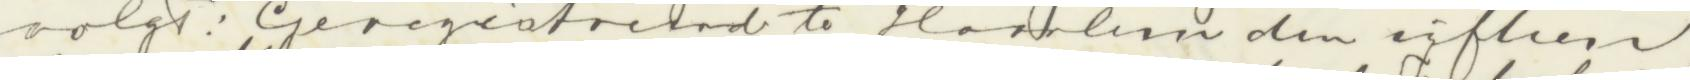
volgt: Geregistreerd te Haarlem den vijftien
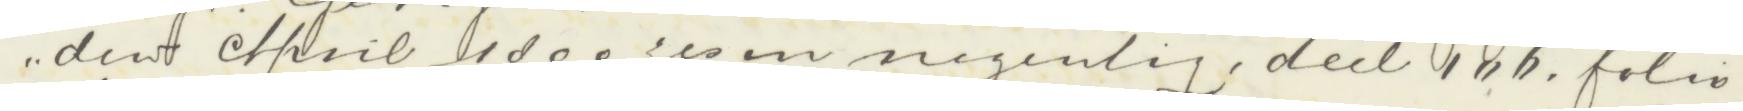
„den April 1800 zes en negentig, deel 106, folio
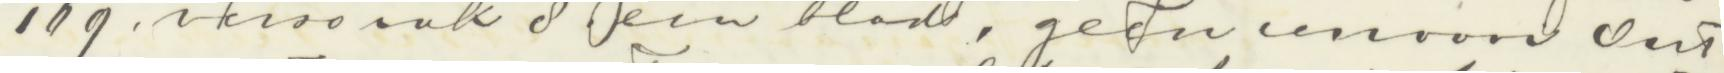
169, verso vak 8, een blad, geen renvooi Ont
